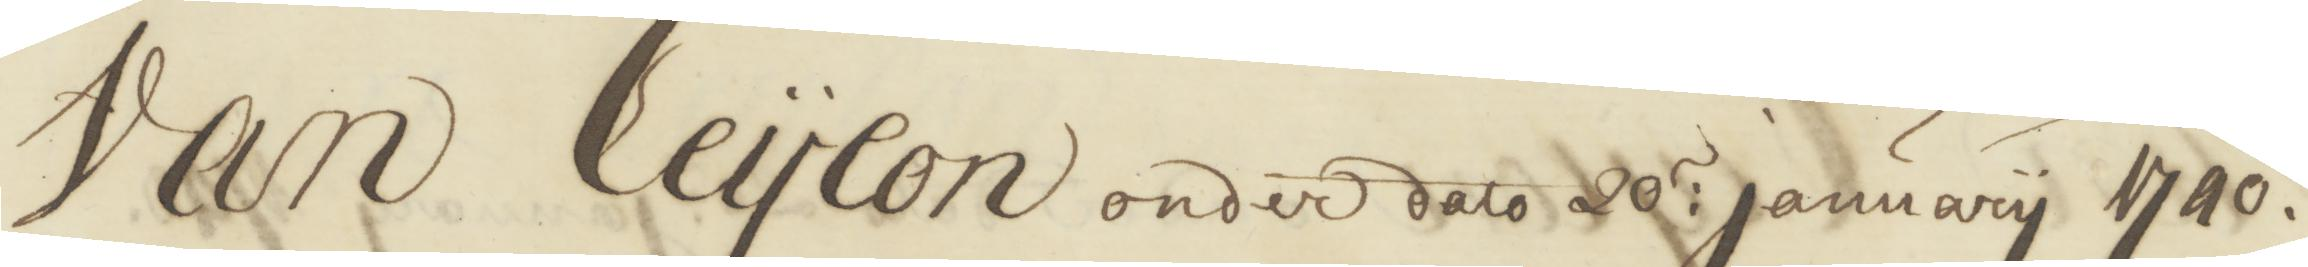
Van Ceijlon onder dato 20:' januarij 1740.
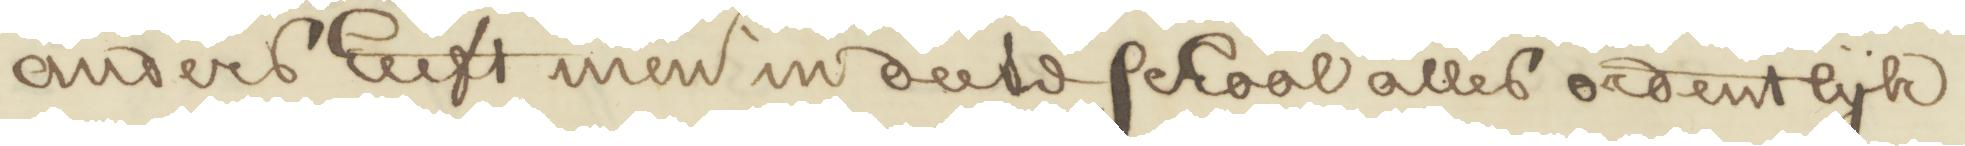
anders heeft men in deese school alles ordentlijk
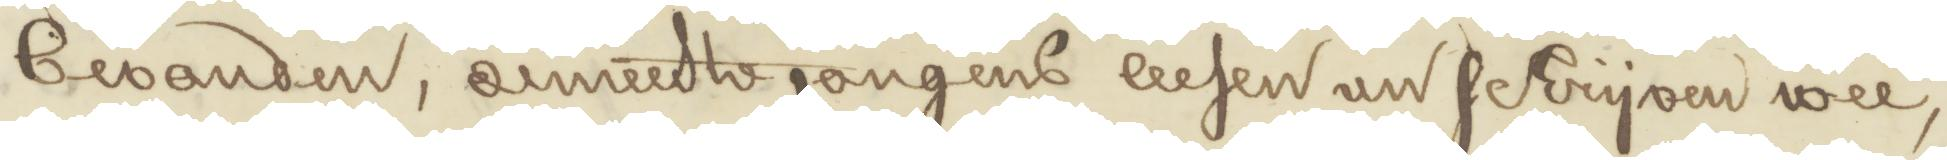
bevonden, demeeste jongens leesen en schrijven wel,
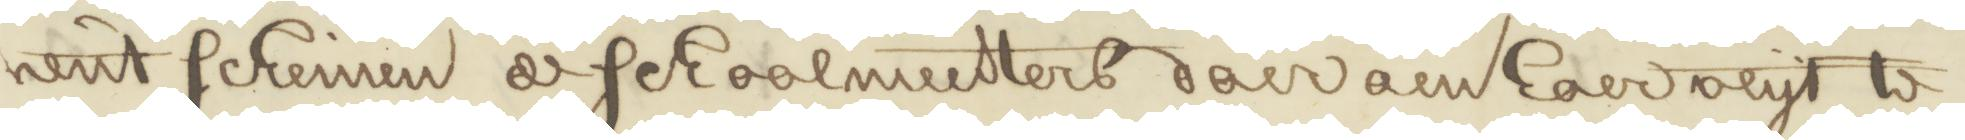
en't scheinen de schoolmeesters daer aen haer vlijt te
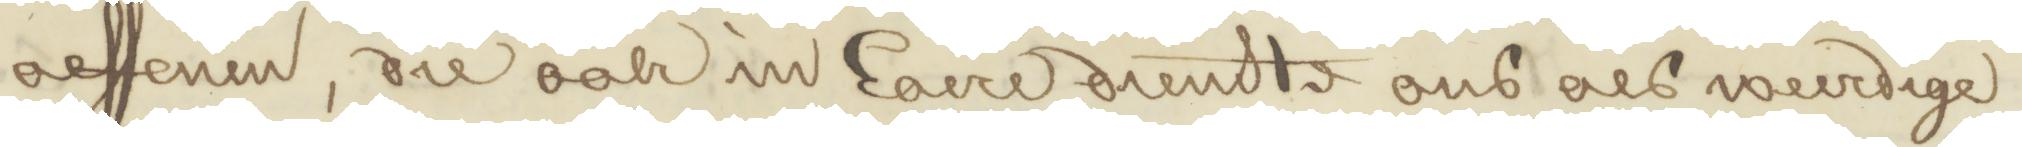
oeffenen, die ook in haere dienste ons als weerdige
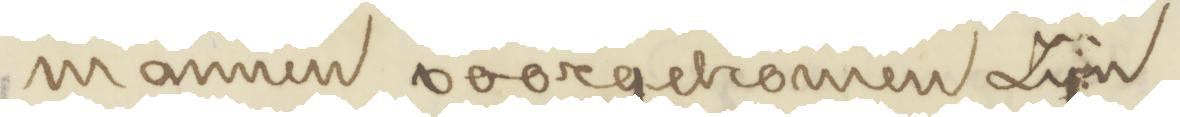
mannen voorgekomen zijn
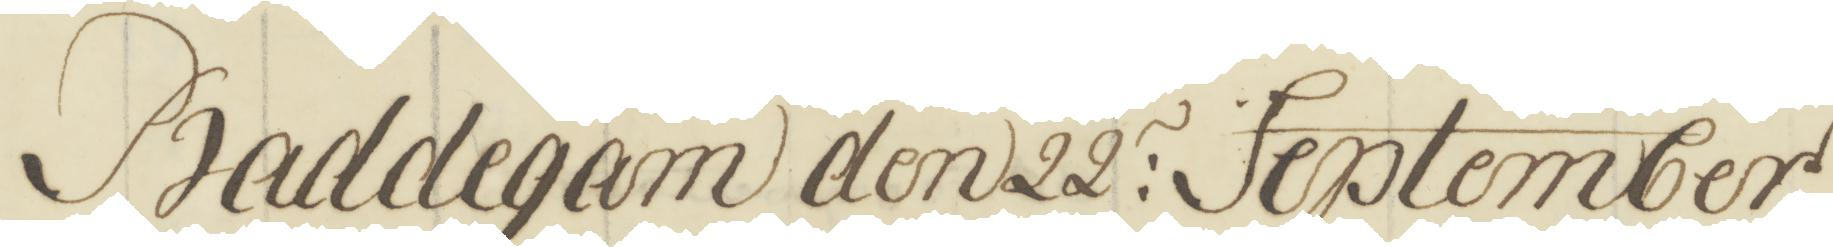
Baddegam den 22:' September
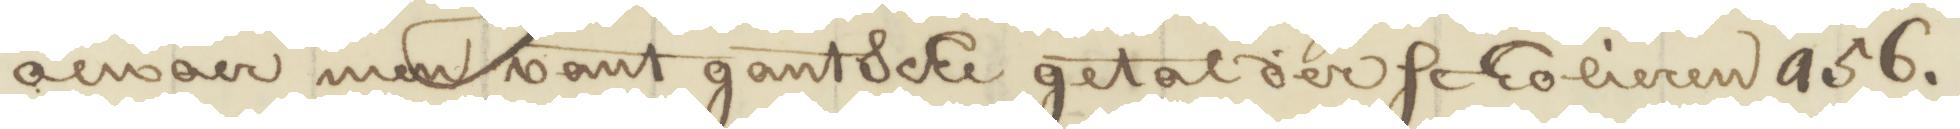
alwaer men vant gantsche getal der scholieren 456.
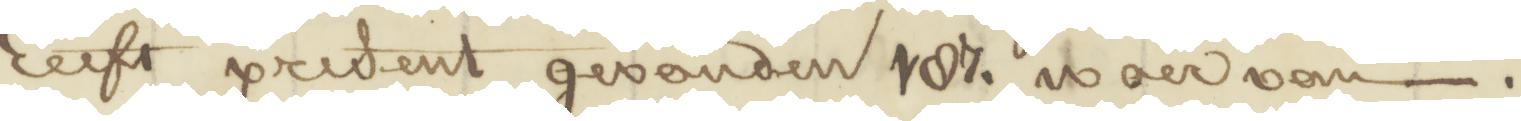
heeft present gevonden 187. waer van.
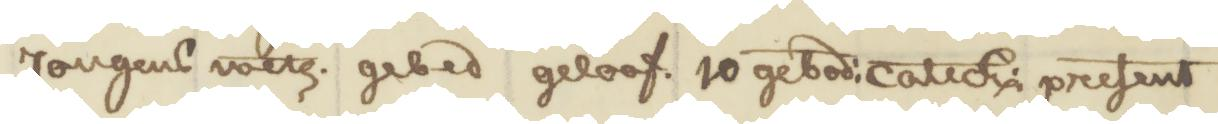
Jongens weten. gebed geloof: 10 gebod: cateck: present
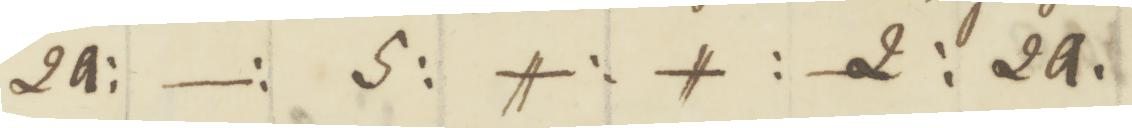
24: —: 5: „ : „ : 2: 24.
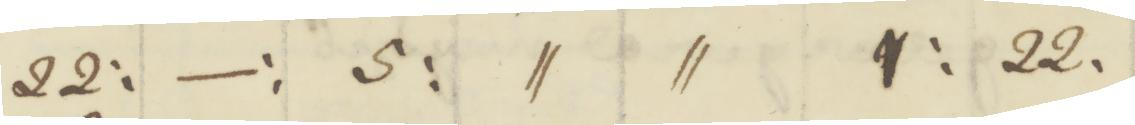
22: —: 5: „ „ 1: 22.
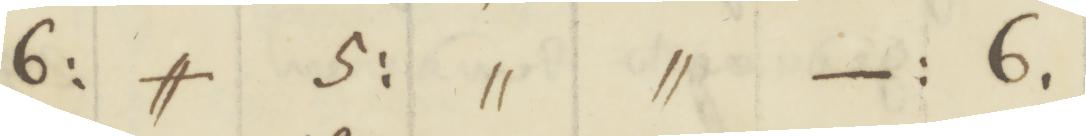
6: „ 5: „ „ — : 6.
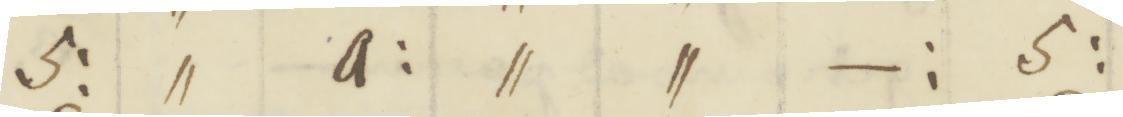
5: „ 4: „ „ — : 5:
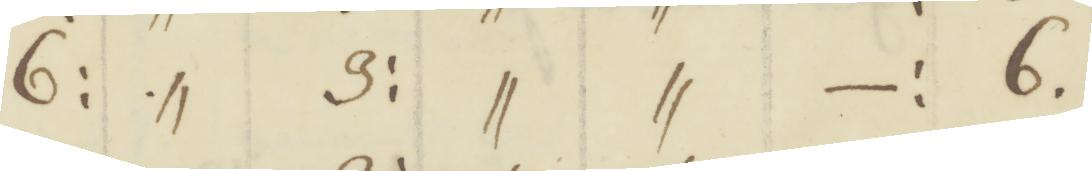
6: „ 3: „ „ —: 6.
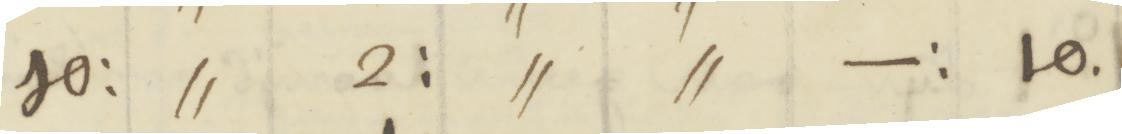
10: „ 2: „ „ —: 10.
